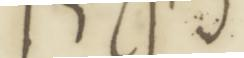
1543
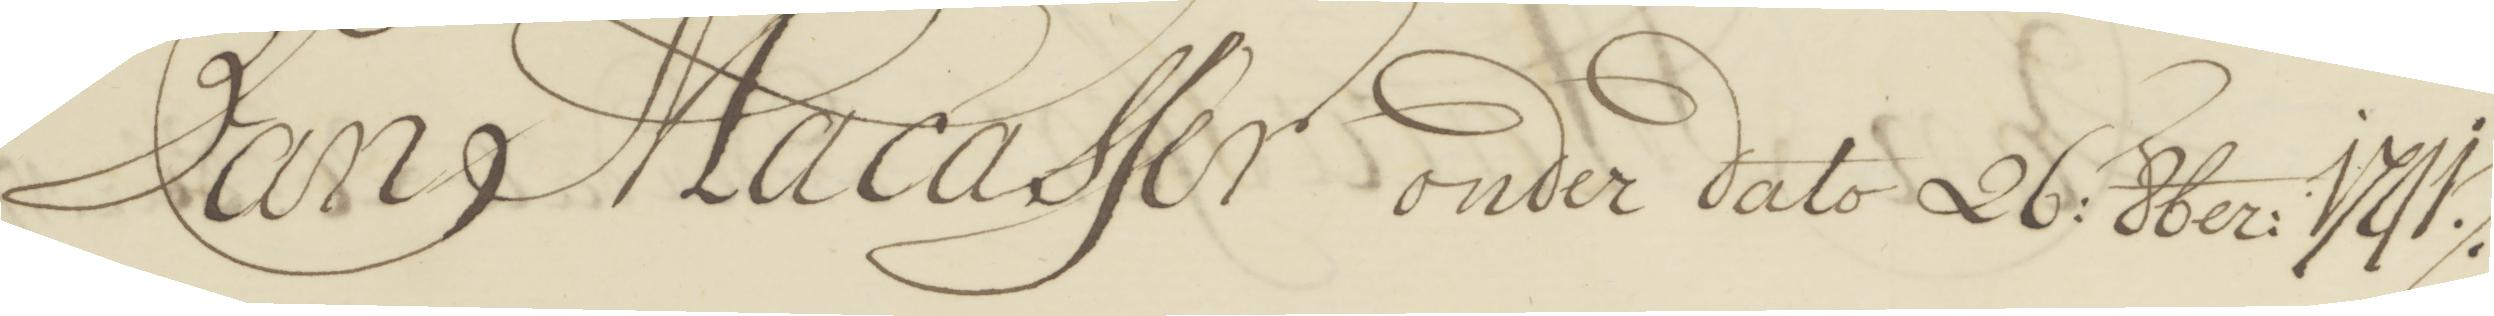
Van Macasser onder dato 26:' 8ber: 1741./.
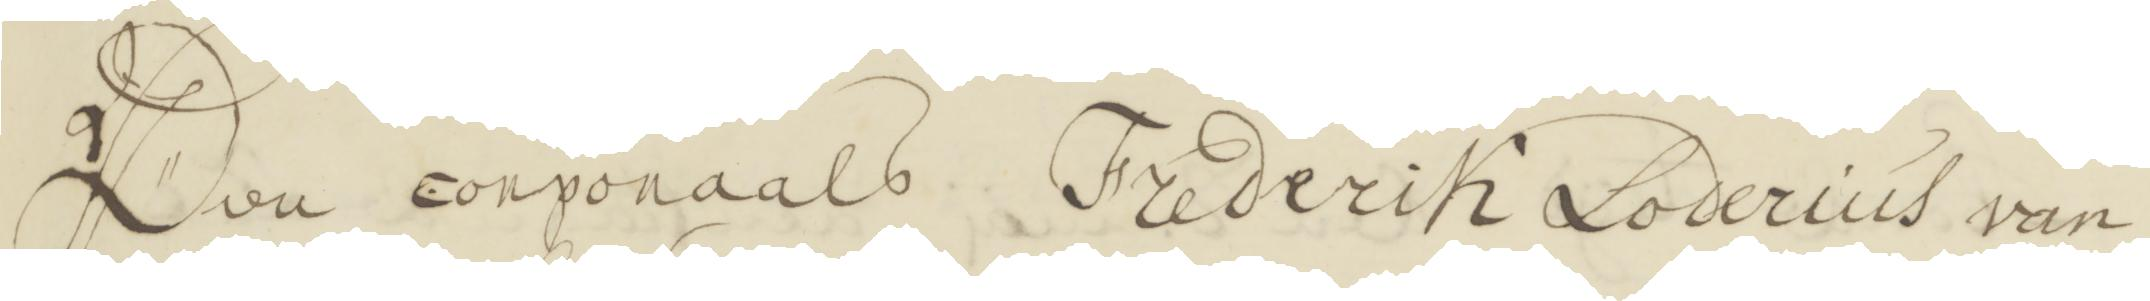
Den corporaals Frederik Loderius van
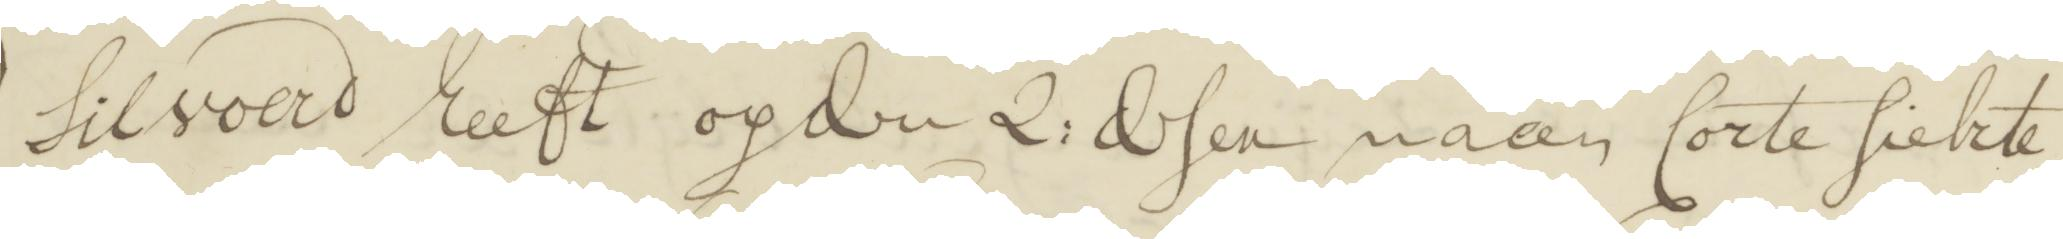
silvoerd heeft op den 2: deser na een Corte siekte
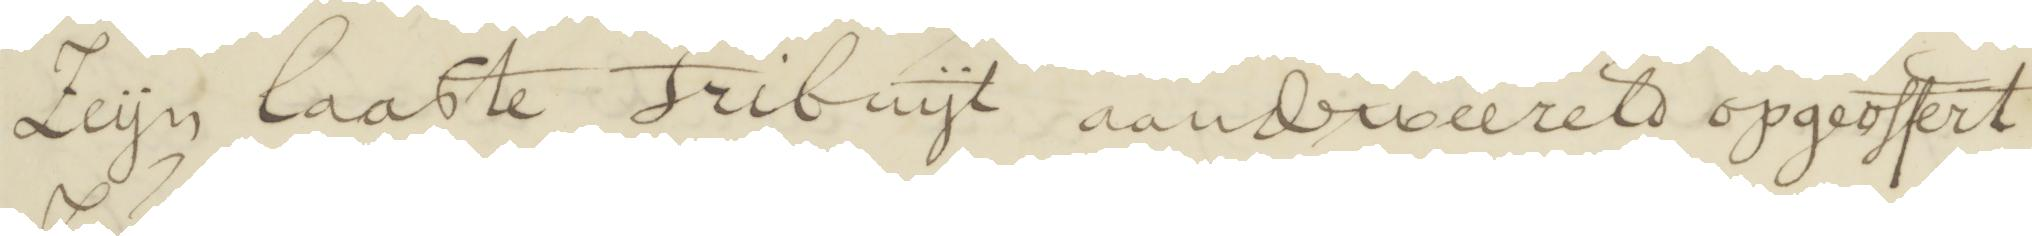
zeijn laaste tribuijt aan de weereld opgeoffert
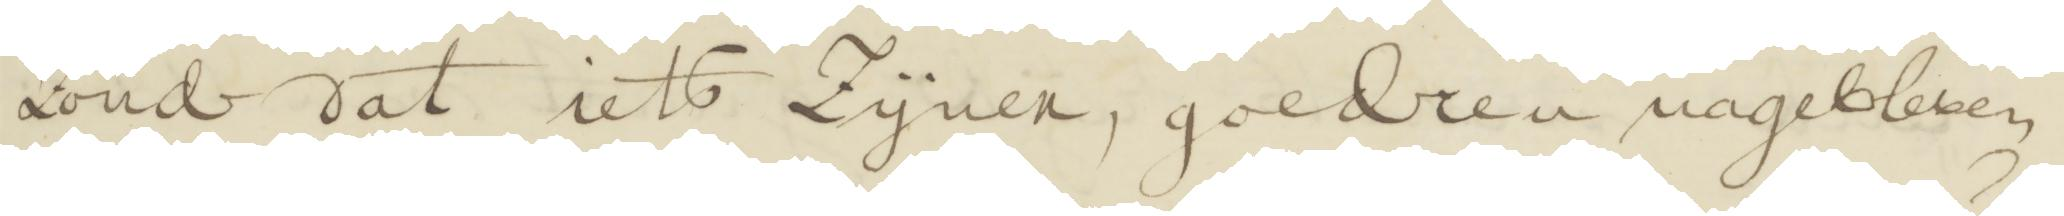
zoude dat iets zijner, goederen nagebleven
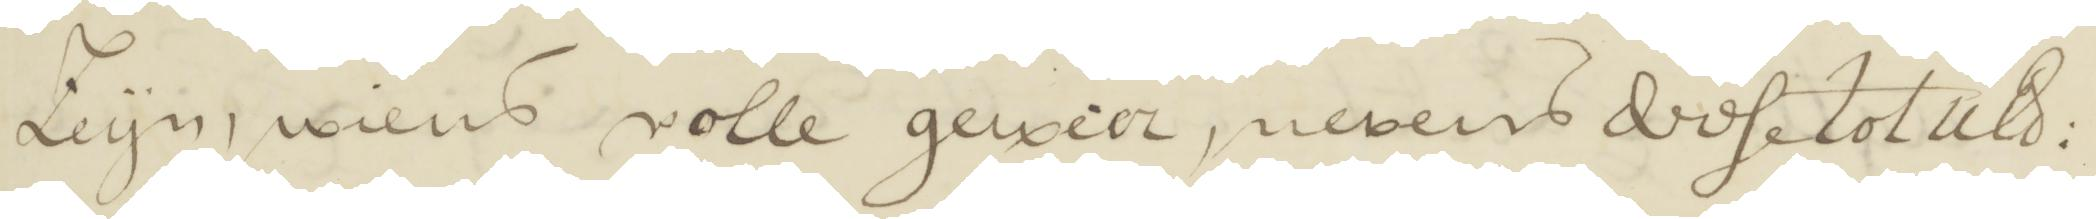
zeijn, wiens volle geweer, nevens deese tot uEd:
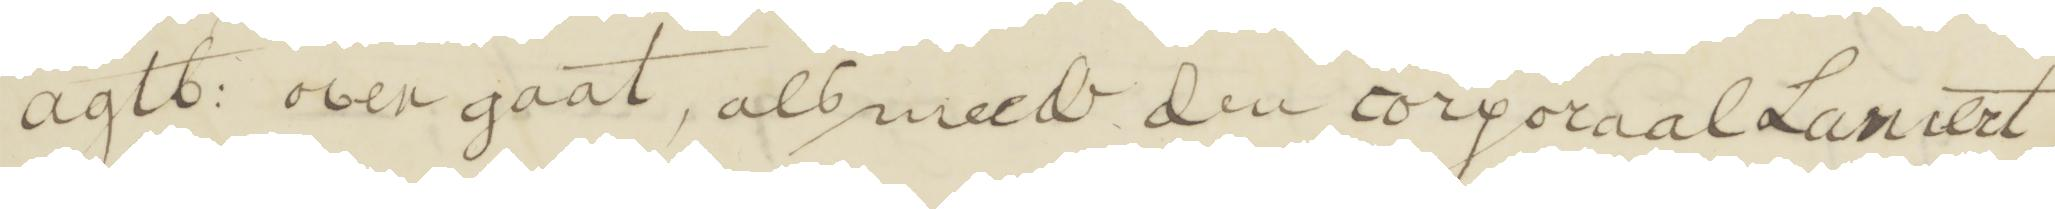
agtb: over gaat, als meede den corporaal Lamert
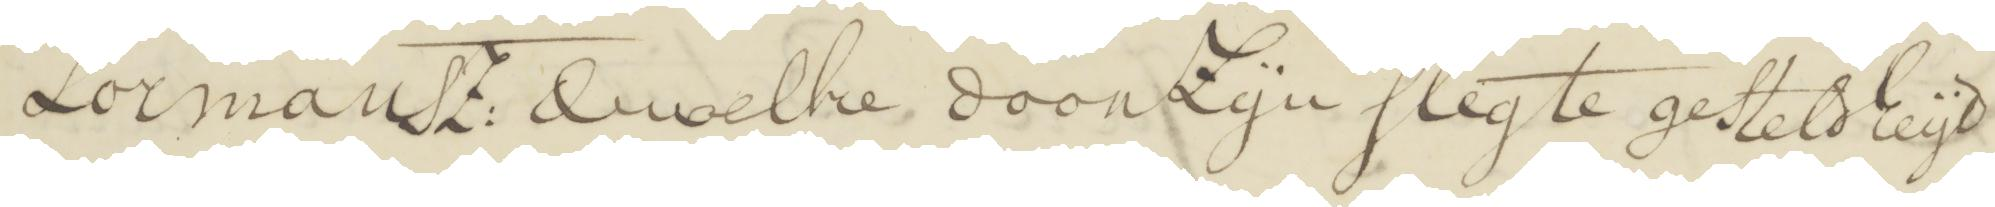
Lormansz: dewelke door zijn slegte gesteldheijd
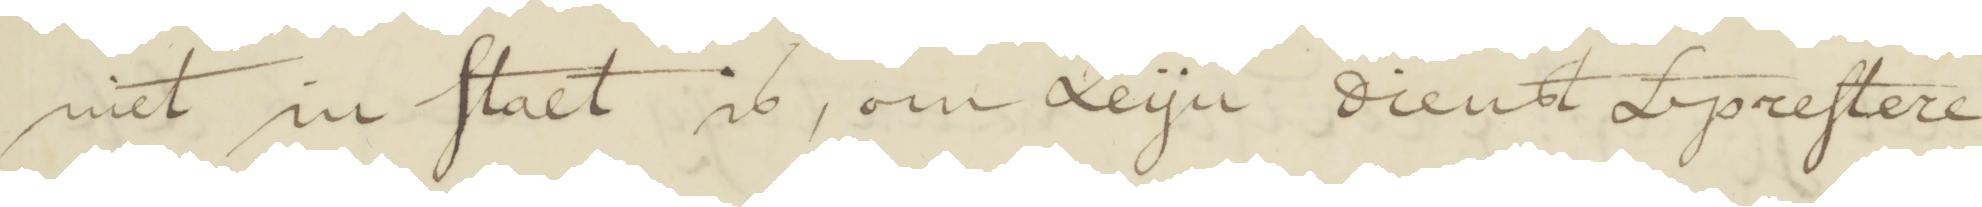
niet in staet is, om zeijn dienst te prestere
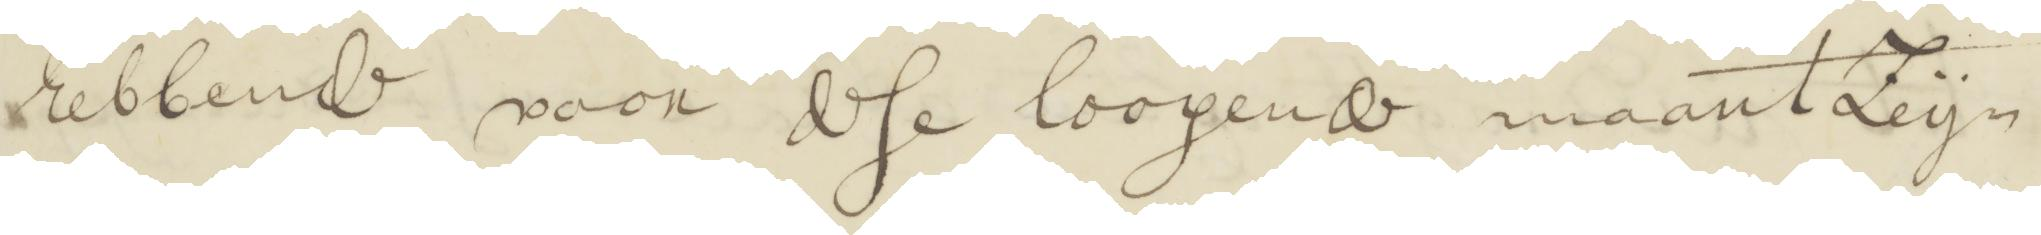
hebbende voor dese loopende maant zeijn
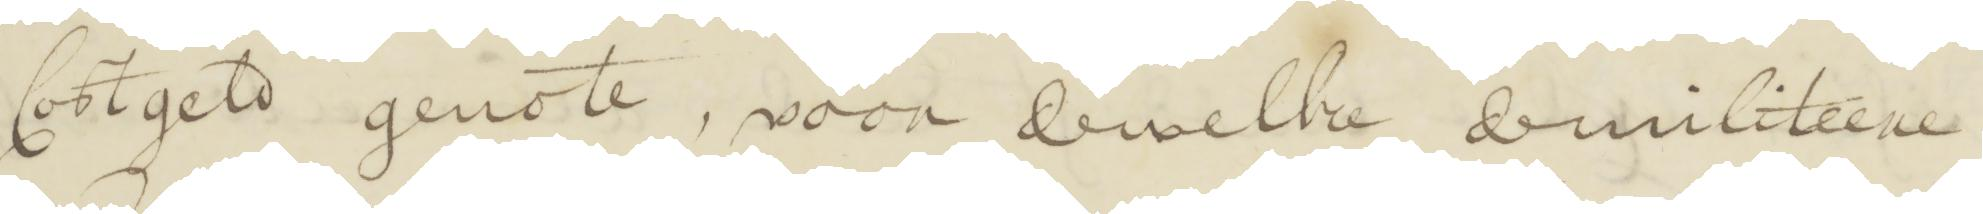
Costgeld genote, voor dewelke de militeere
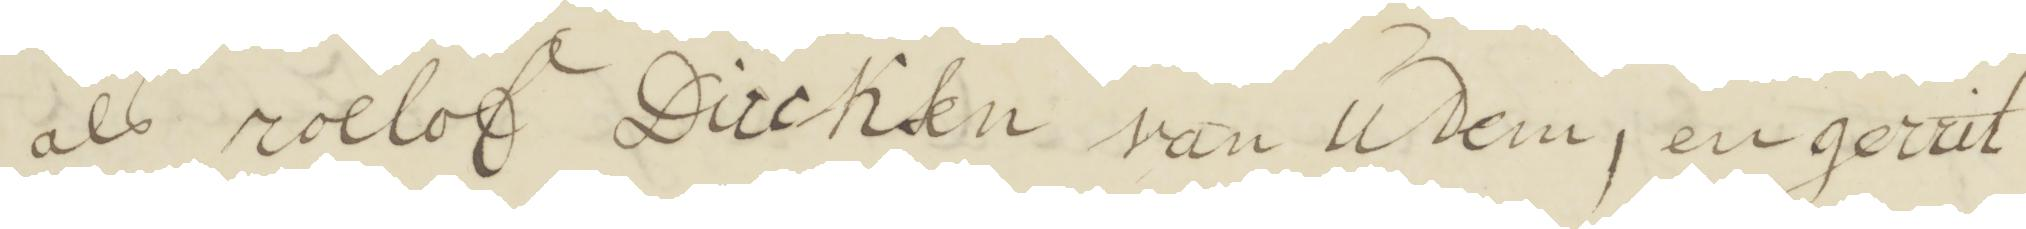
als roelof Dircksen van udem, en gerrit
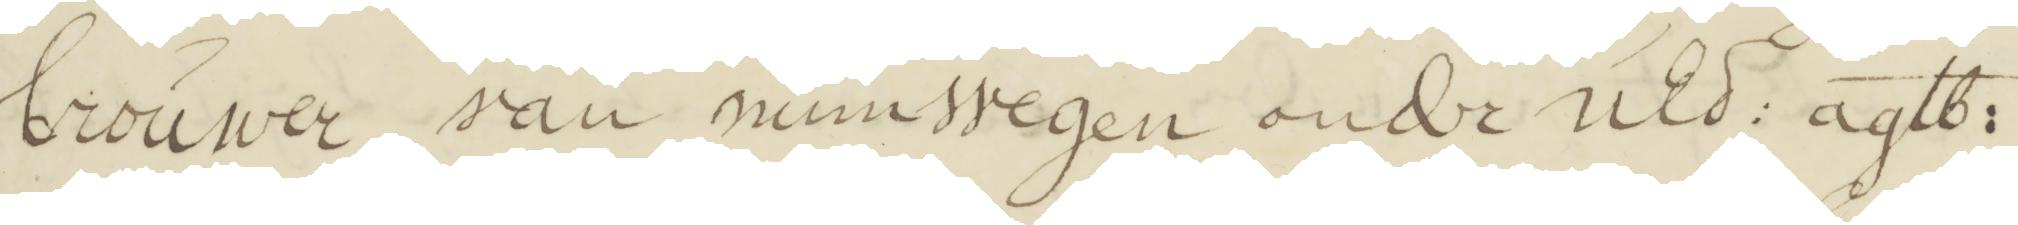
brouwer van numwegen onder uEd: agtb:
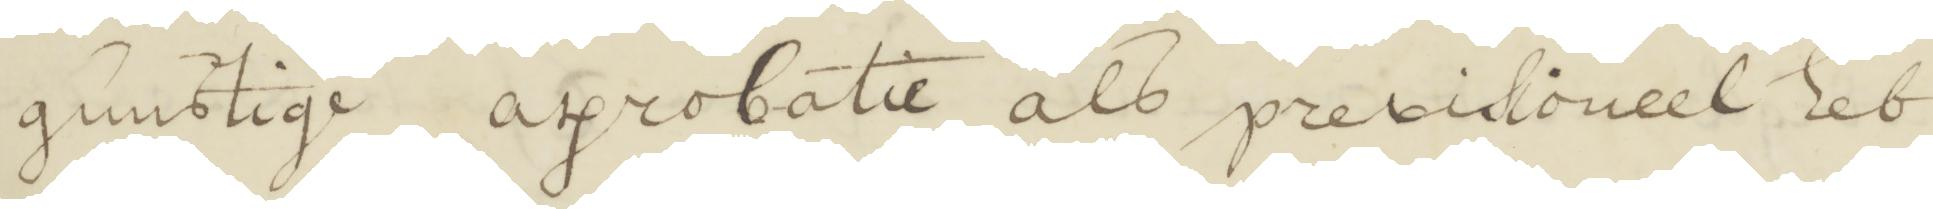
gunstige aprobatie als previsioneel heb
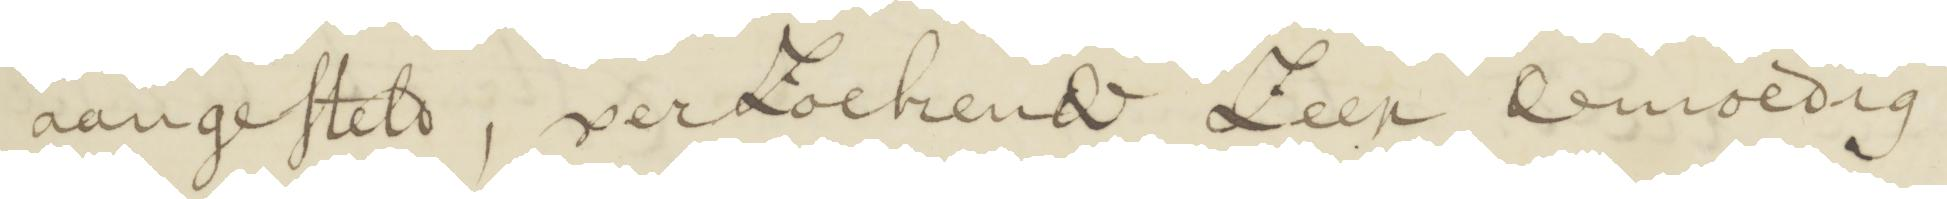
aangesteld, verzoekende zeer demoedig
